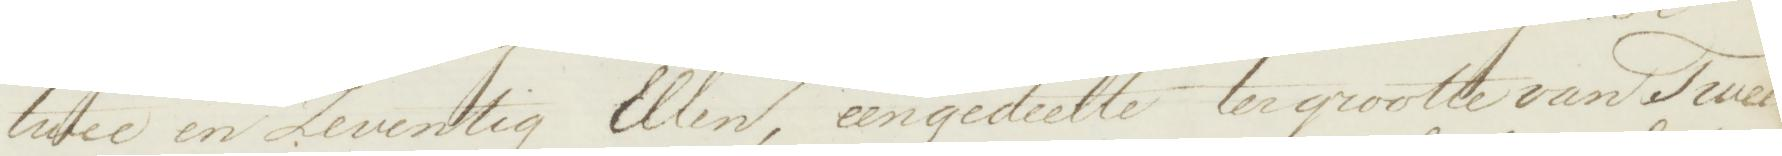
twee en Zeventig Ellen, een gedeelte ter grootte van Twee
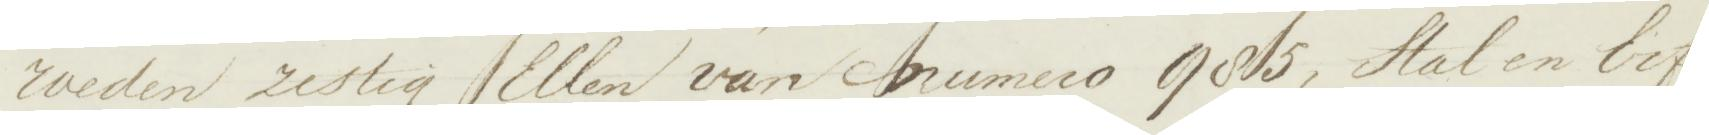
roeden zestig Ellen van numero 985, Stal en Erf
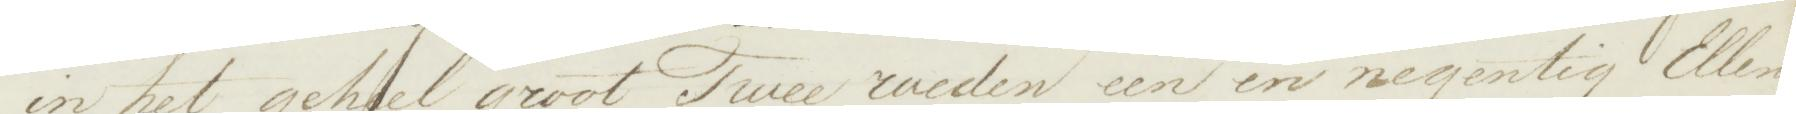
in het geheel groot Twee roeden een en negentig Ellen
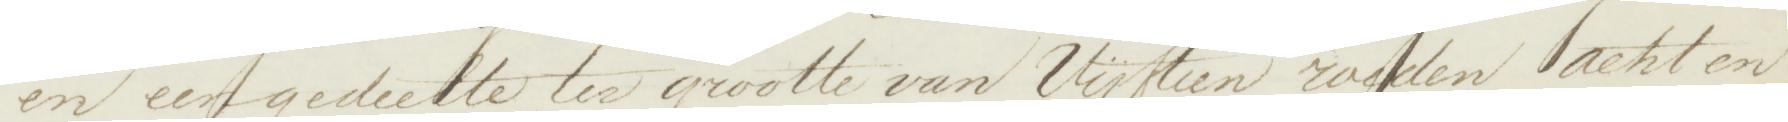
en een gedeelte ter grootte van Vijftien roeden acht en
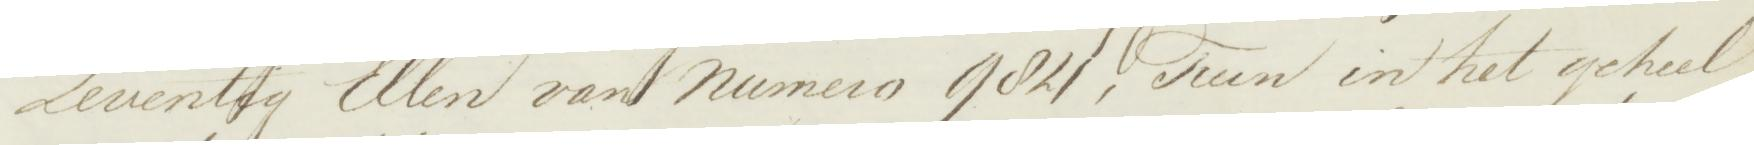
Zeventig Ellen van Numero 984, Tuin in het geheel
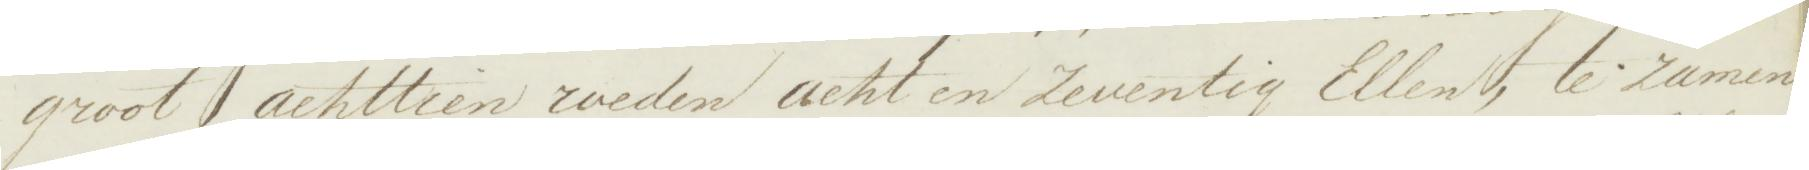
groot achttien roeden acht en zeventig Ellen, te zamen
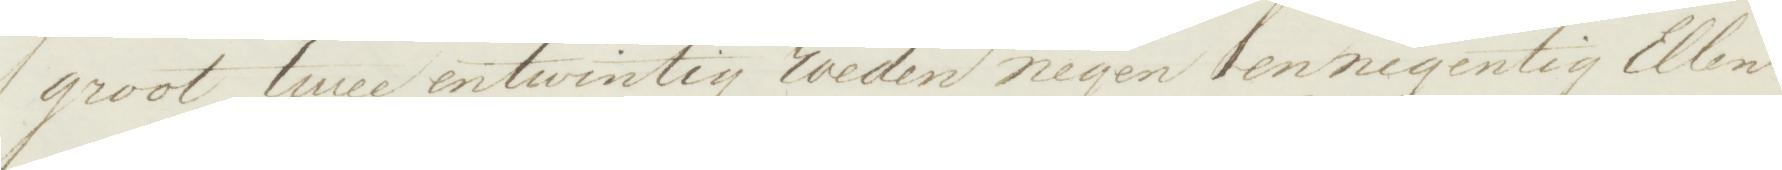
groot twee entwintig roeden negen en negentig Ellen
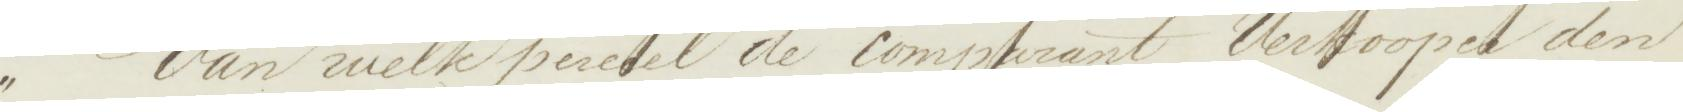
„ Van welk perceel de comparant verkooper den
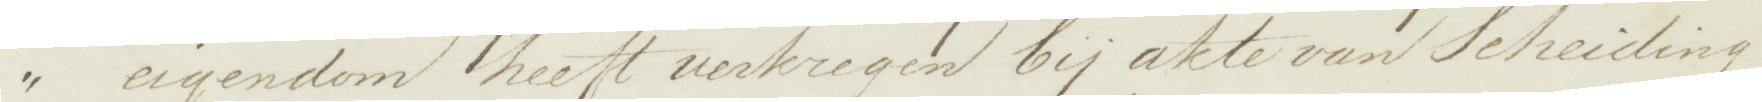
„ eigendom heeft verkregen bij akte van Scheiding
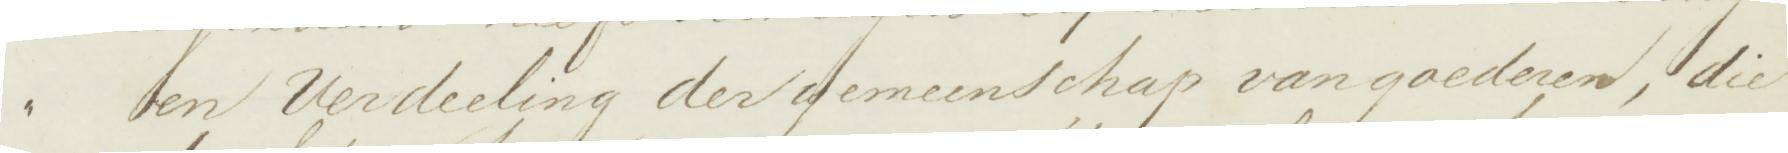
„ ten verdeeling der gemeenschap van goederen, die
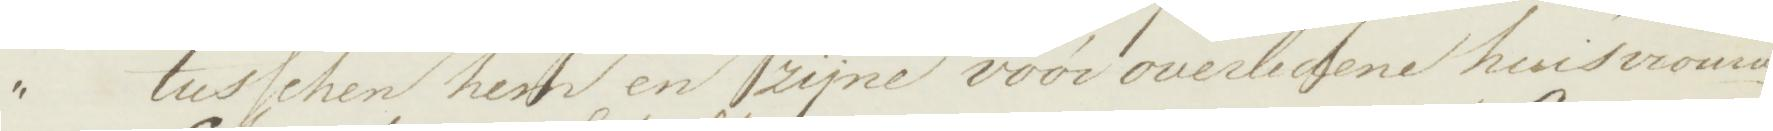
„ tusschen hem en zijne vóór overledene huisvrouw
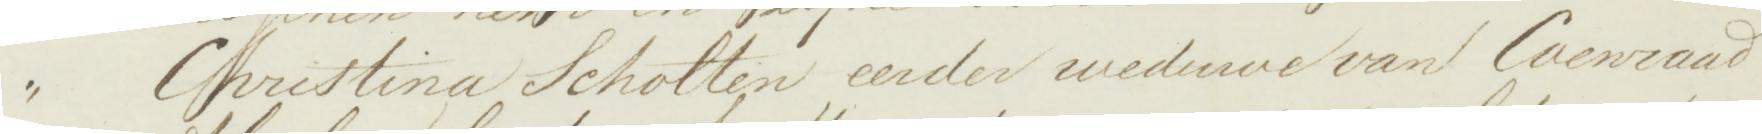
„ Christina Scholten eerder weduwe van Coenraad
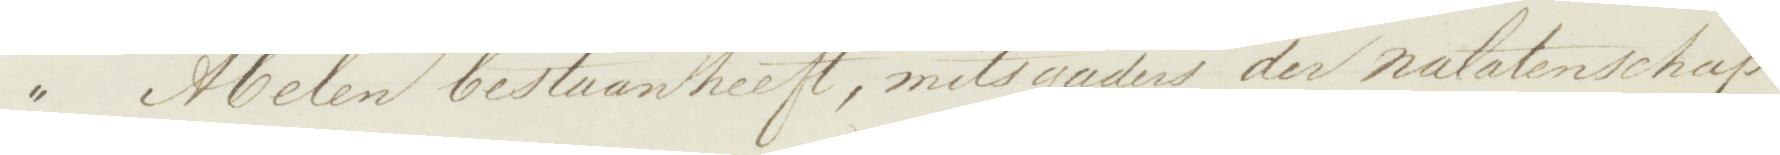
„ Abelen bestaan heeft, mitsgaders der nalatenschap
